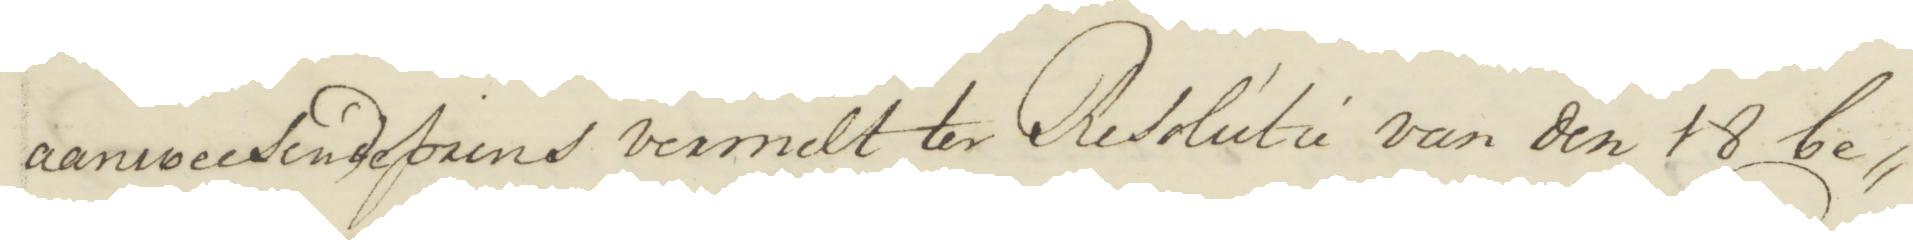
aanweesende prins vermelt ter Resolutie van den 18 be„
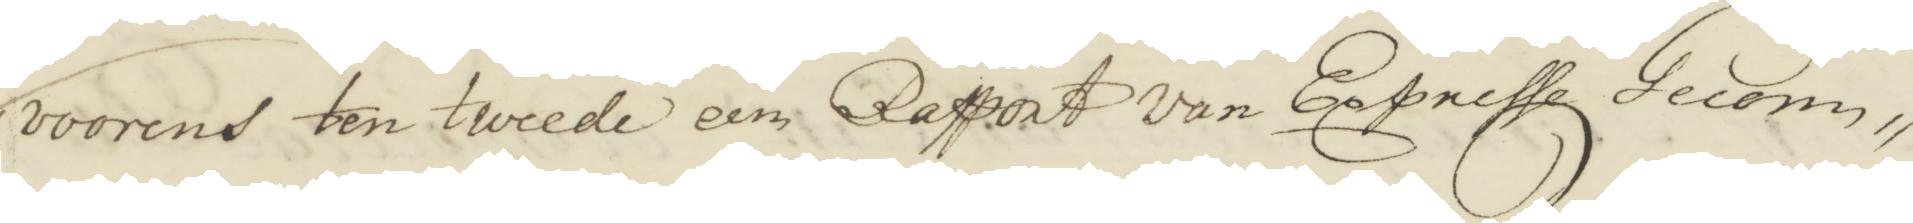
voorens ten tweede een Rapport van Expresse Gecom„
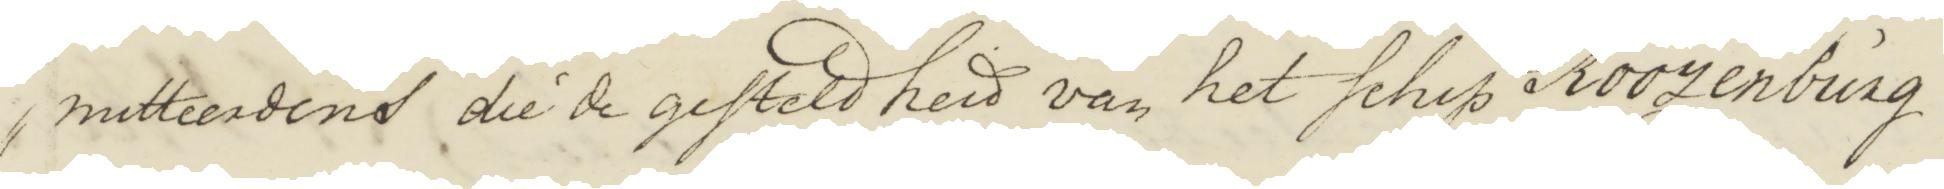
„mitteerdens die de gesteldheid van het schip Roozenburg
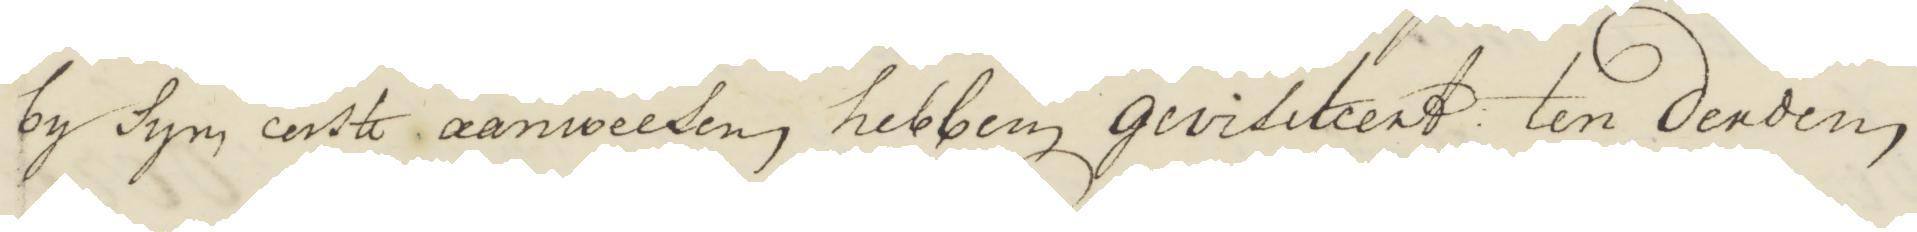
by syn eerste aanweesen hebben gevisiteert: ten derden
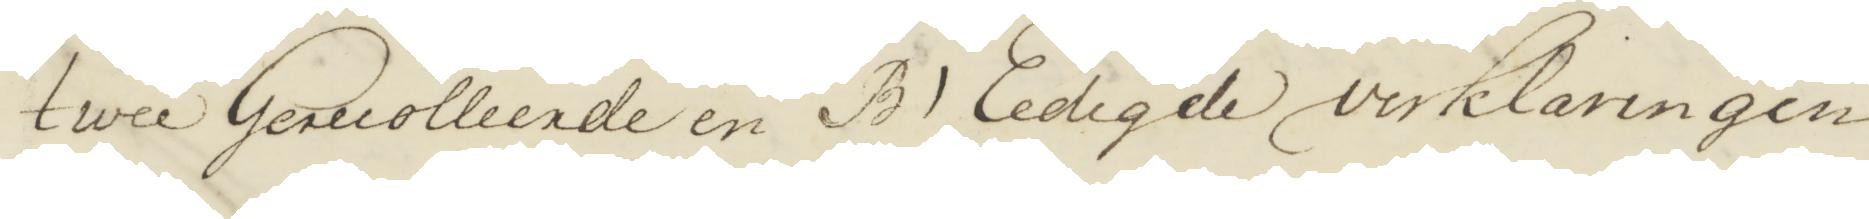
twee Gerecolleerde en B' Eedigde verklaringen
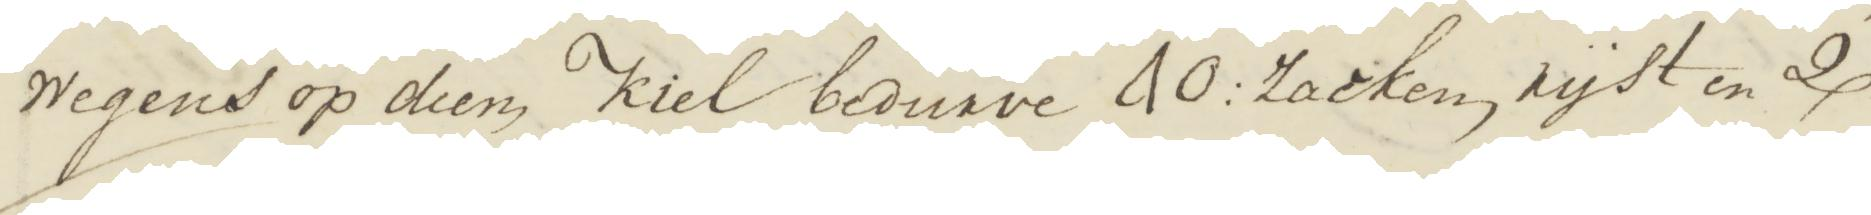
wegens op dien Kiel bedurve 40: zacken rijst en 2
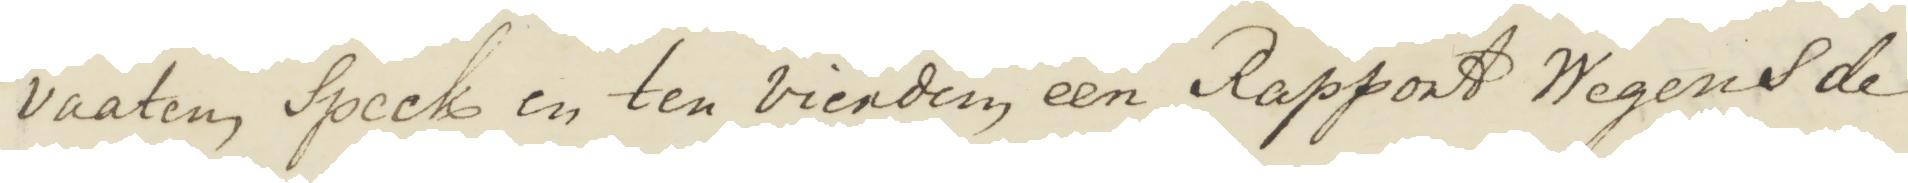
vaaten speck en ten vierden een Rapport Wegens de
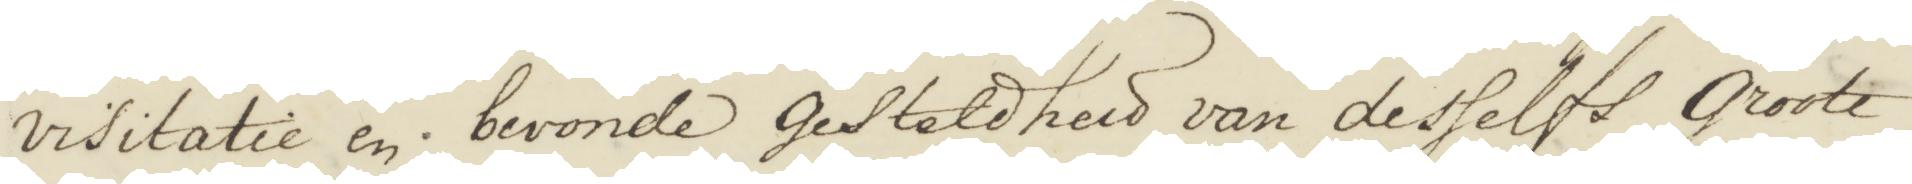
visitatie en bevonde gesteldheid van desselfs groote
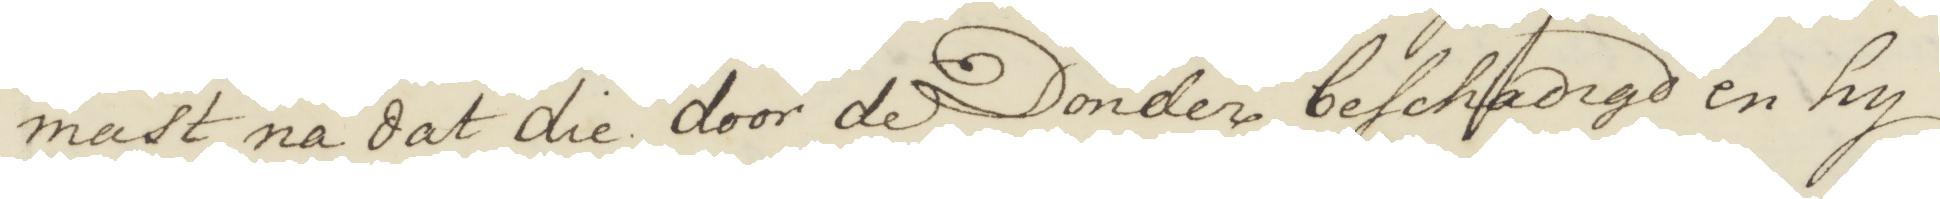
mast na dat die door de Donder beschadigd en hy
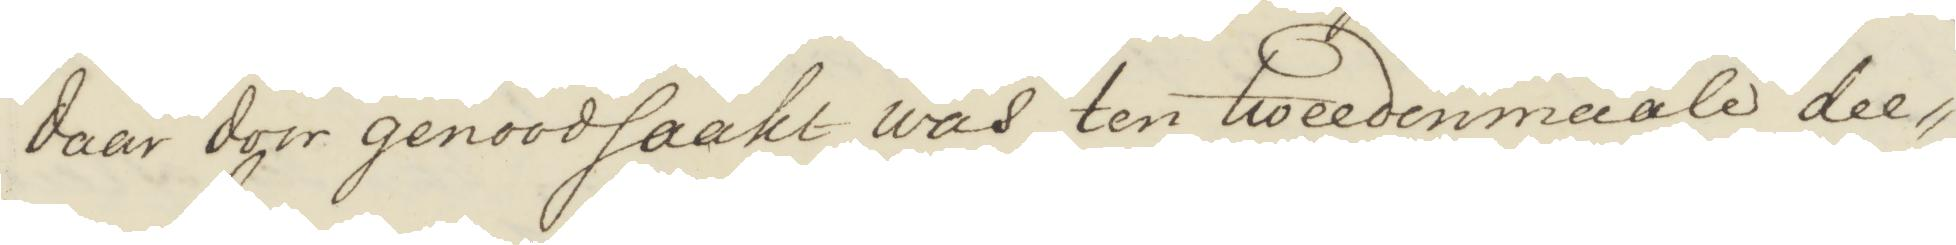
daar door genoodsaakt was ten tweedenmaale dee„
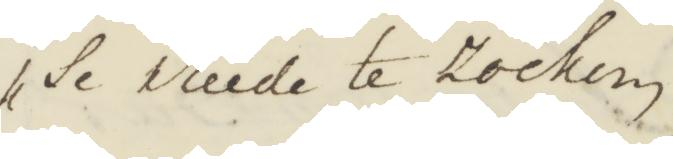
„se rheede te zoeken
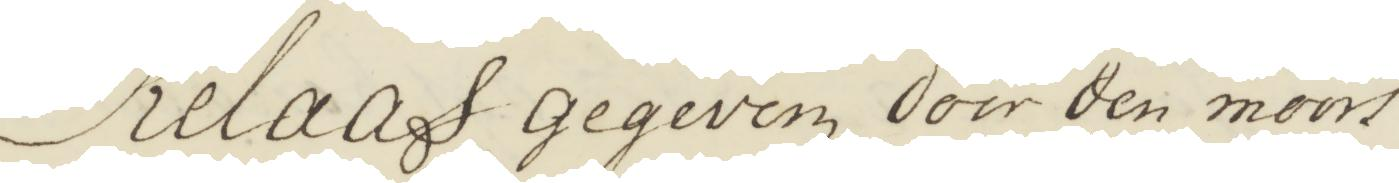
Relaas gegeven door den moors
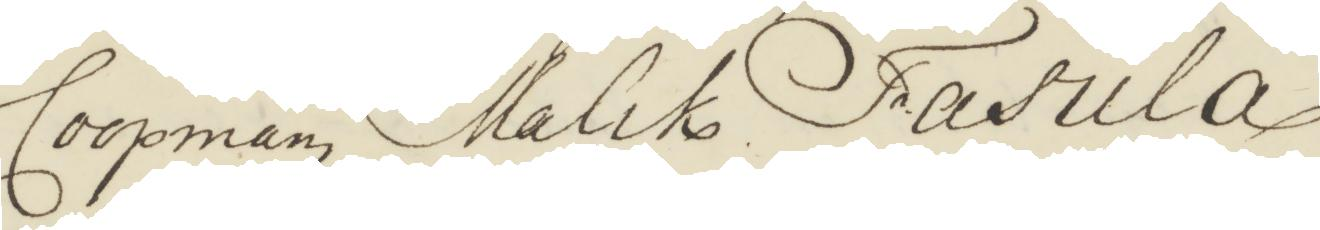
Coopman Malik Fasula
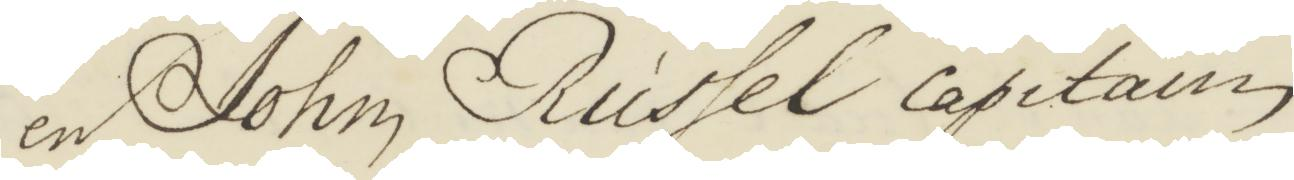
en John Russel capitain
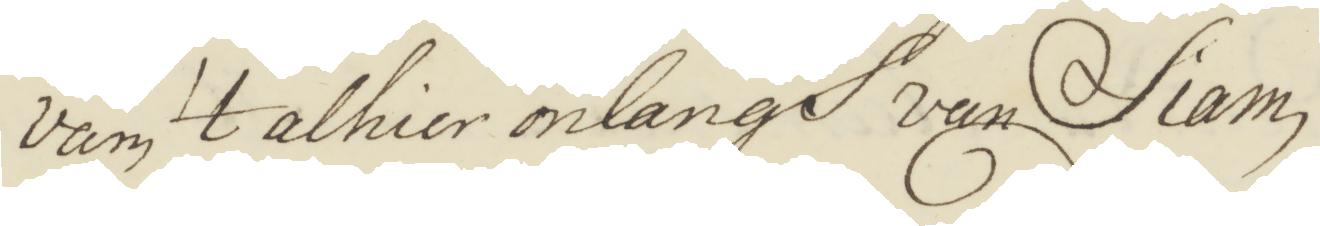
van ’t alhier onlangs van Siam
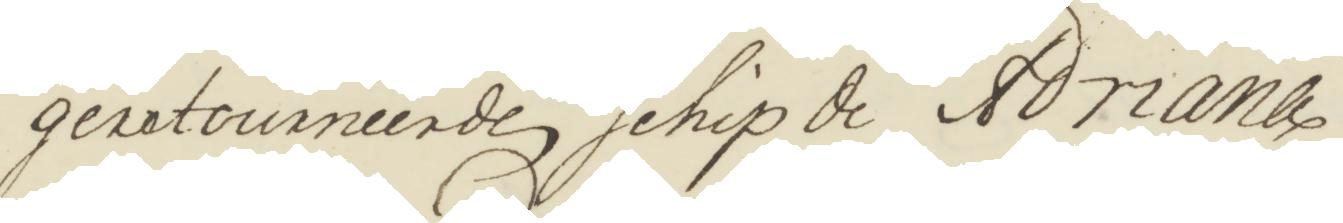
geretourneerde schip de Adriana
